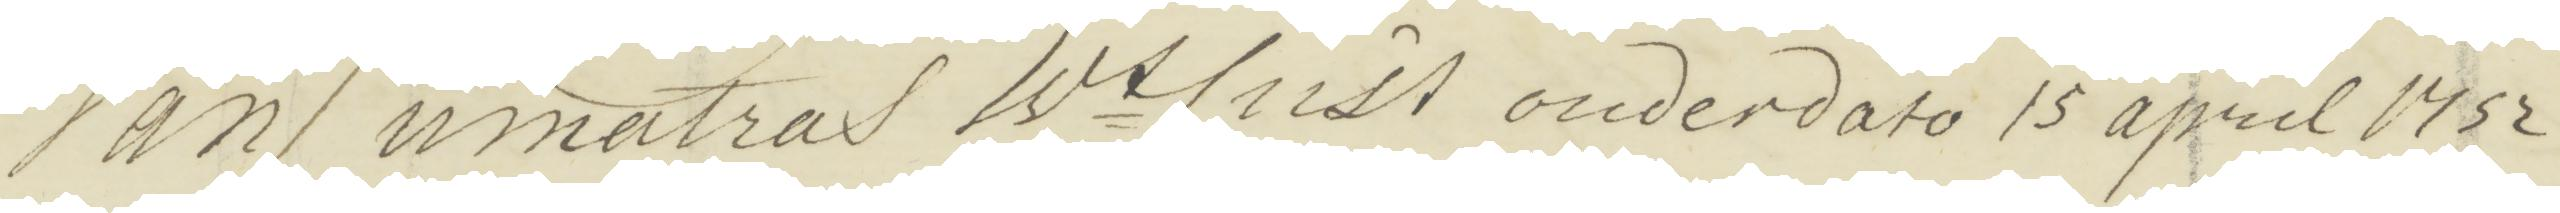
Van Sumatras W=tCust onderdato 15 april 1752
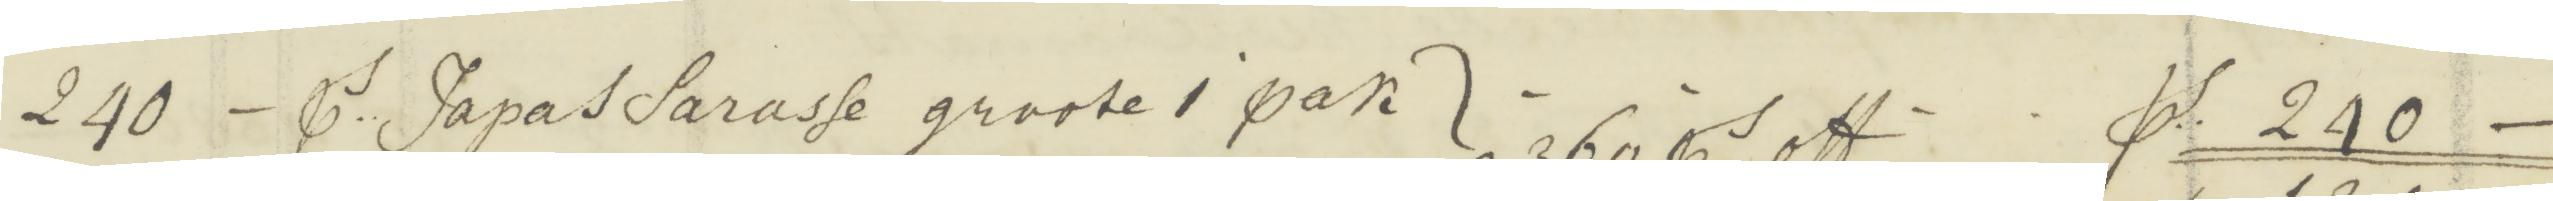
240 - p..s Japas Sarasse groote 1 pan - - - - p..s 240
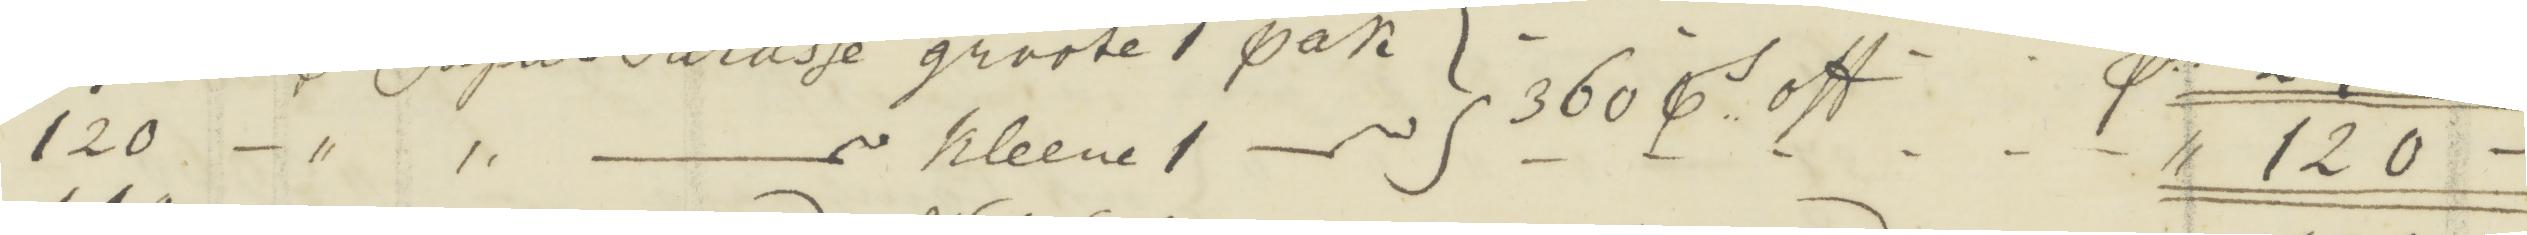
120 - „ „ _' kleene 1 _' 360 p:s off - „ 120
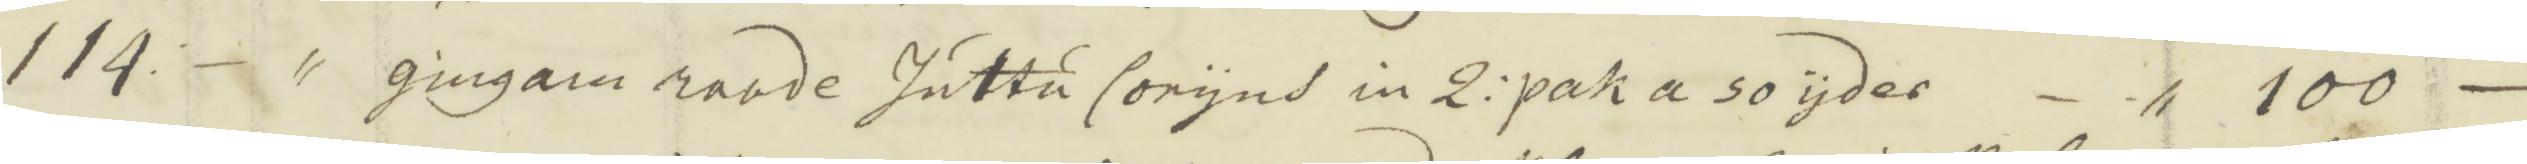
114. - „ gingam roode Juttu Corijns in 2: pak a 50 ijder - „ 100 -
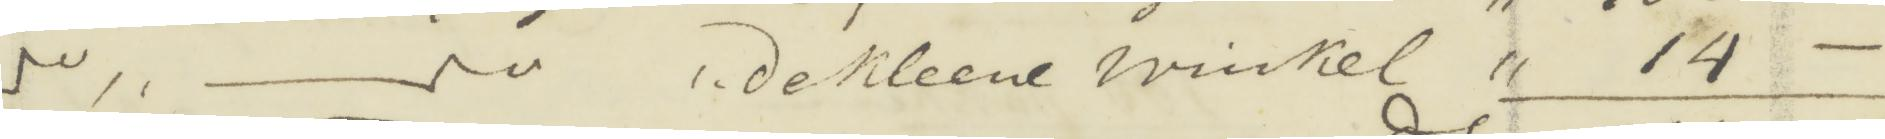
_' „ _' „ de kleene winkel „ 14
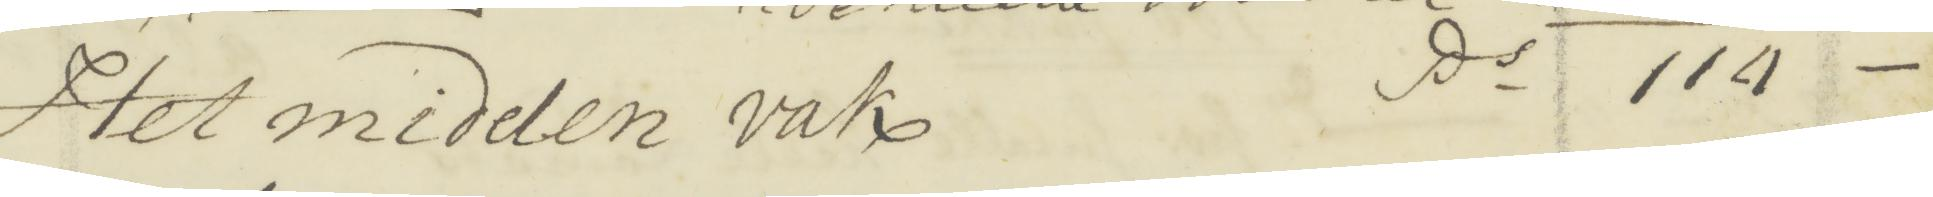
Het midelen vak P-s 114
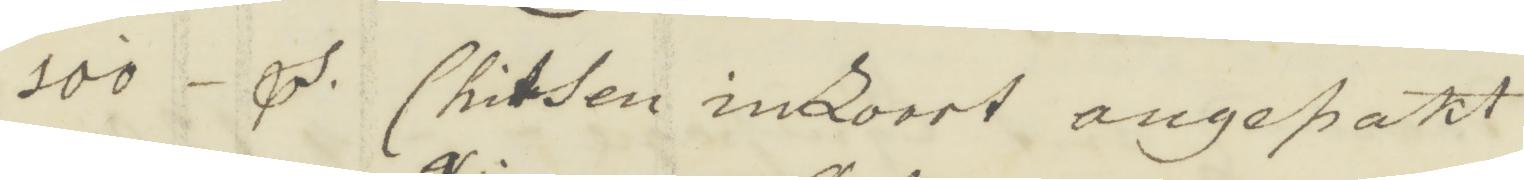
100 - p.s Chitsen inZoort angepakt
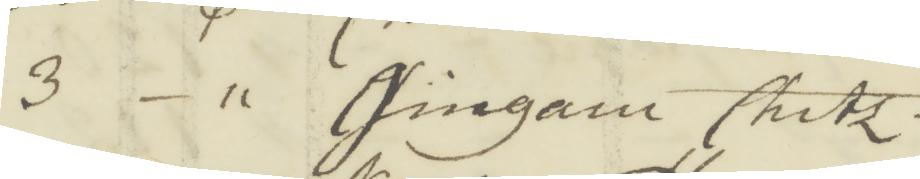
3 - „ Gingam Chitz
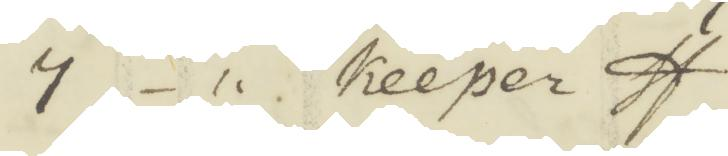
7 - „. keeper ff
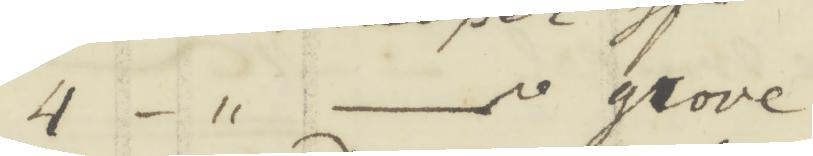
4 - „ _o grove
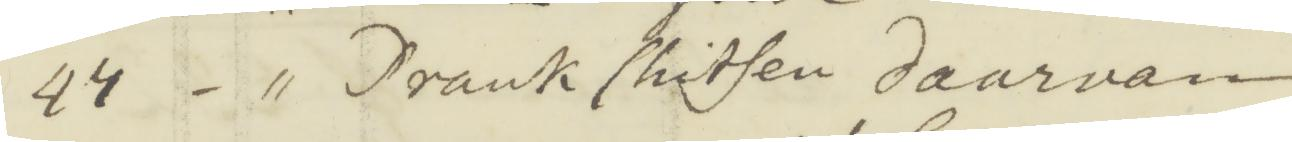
47 - „ Prank Chitsen daarvan
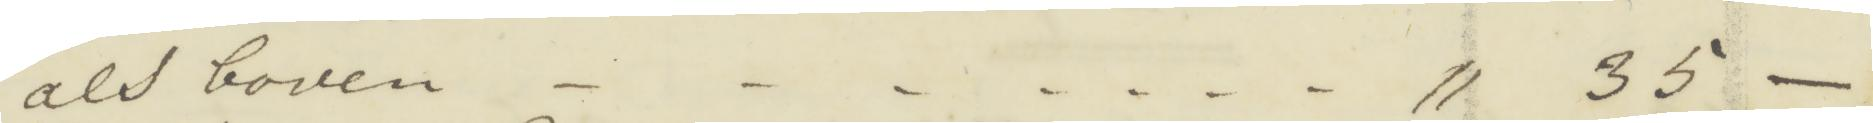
als boven- - - - -- „ 35
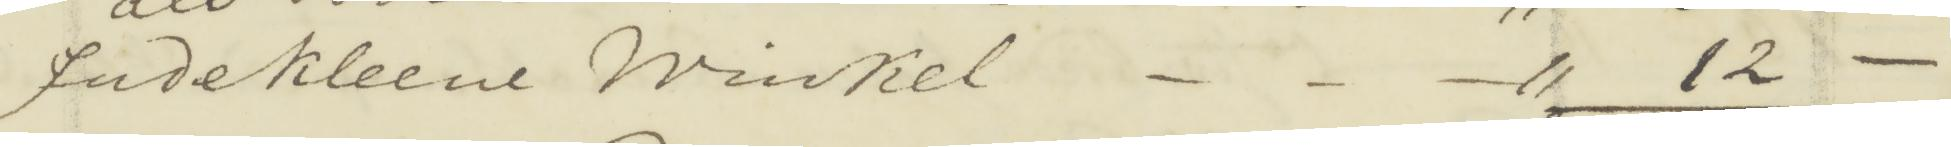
Jnde kleene Winkel - - - „ 12 -
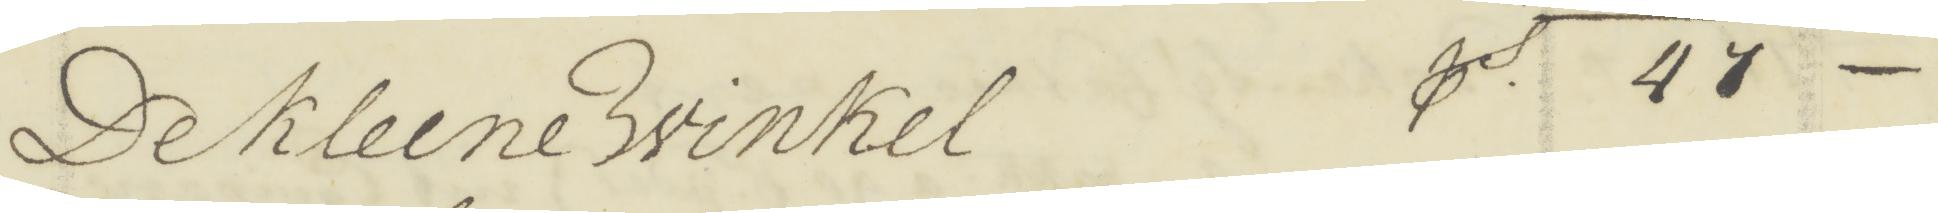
De kleene winkel p.s 47
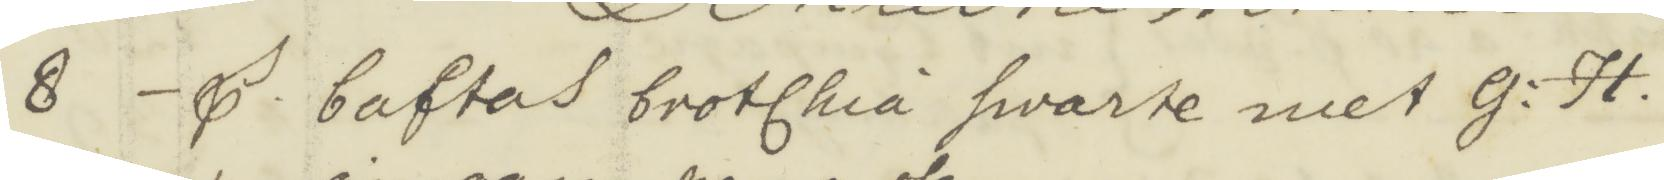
8 - p.s baftas brotchia swarte met g: H.
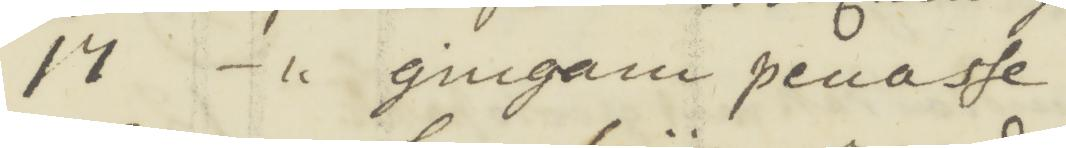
17 - „ gingam penasse
